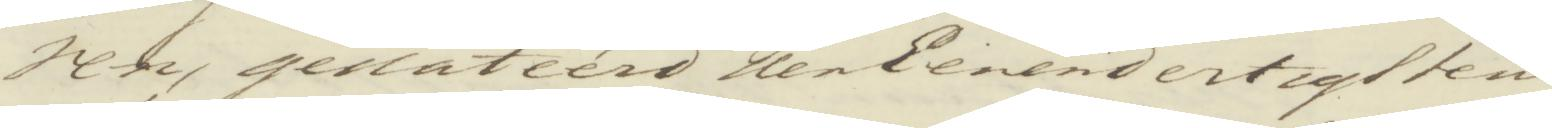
ven, gedateerd den Eenendertigsten
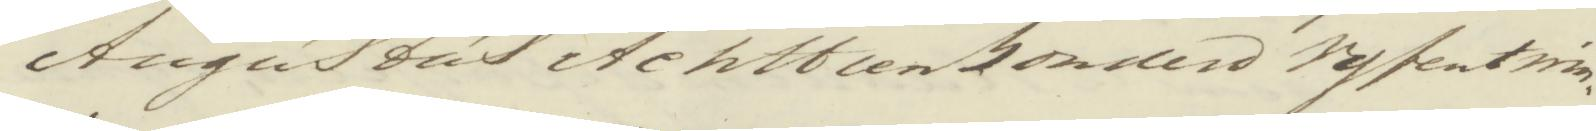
Augustus Achttien Honderd Vyfentwin„
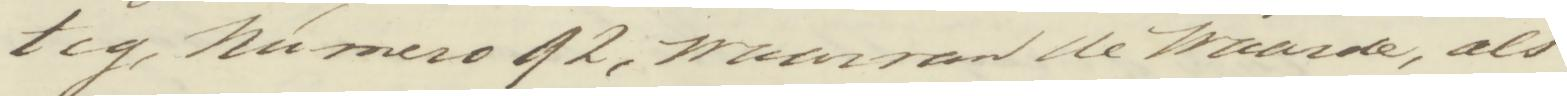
tig, Numero 42, waarvan de waarde, als
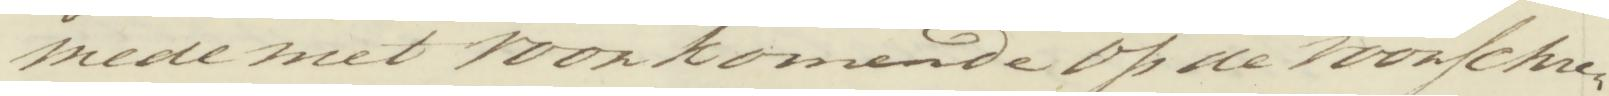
mede met voorkomende op de voorschre„
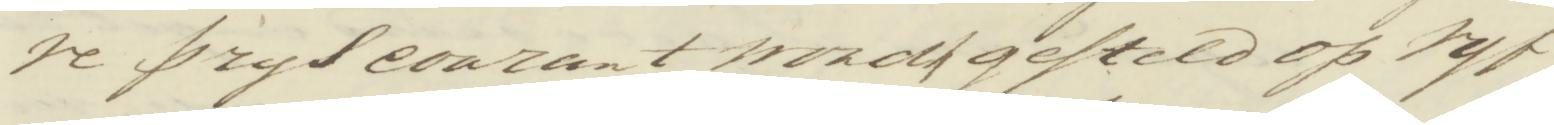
ve Prys courant wordt gesteld op vyf
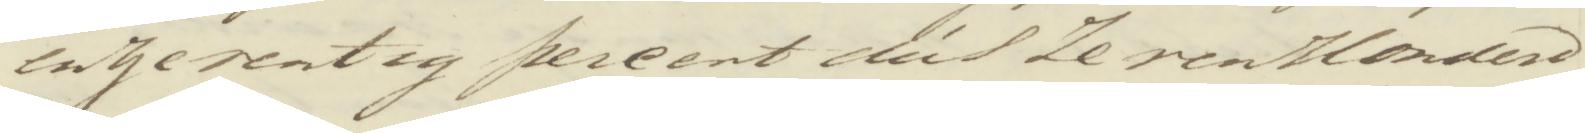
enzeventig Percent dus Zeven Honderd
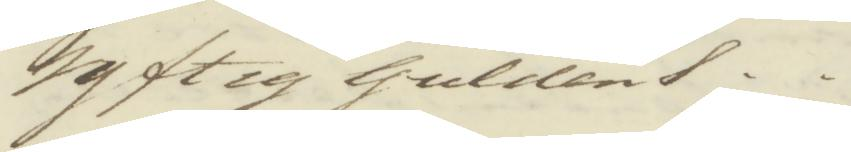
Vyftig Guldens - -
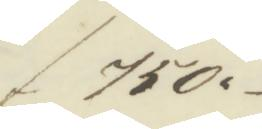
ƒ 750„ —
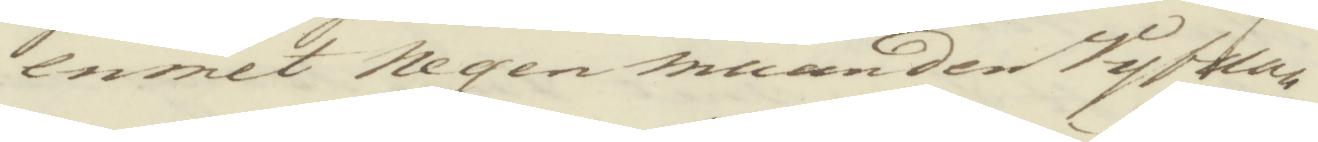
en met Negen Maanden Vyf da
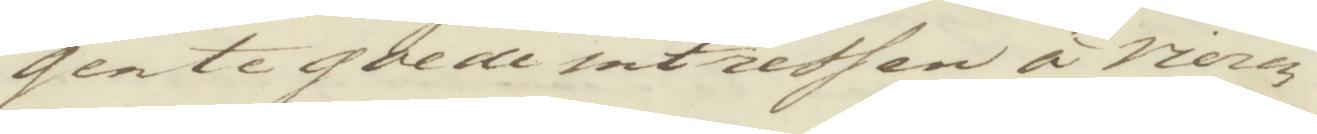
gen te goede intressen à vier en
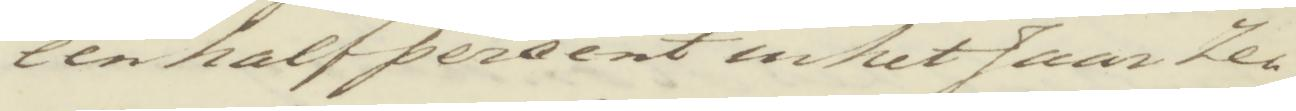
een half percent in het Jaar ze
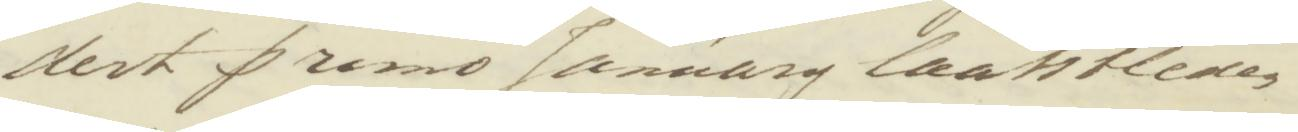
dert Primo January laatstleden
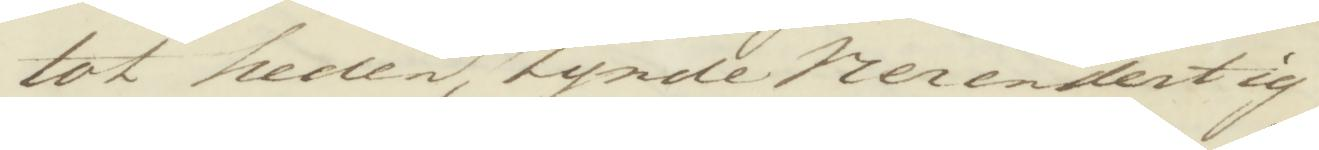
tot heden, zynde vierendertig
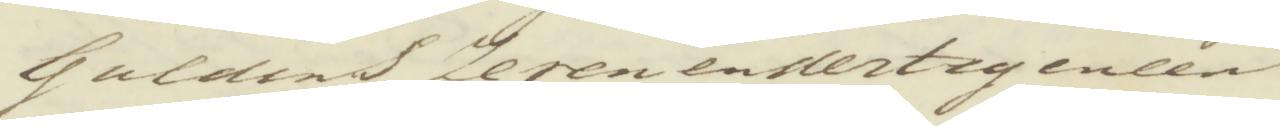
Guldens Zeven en dertig en een
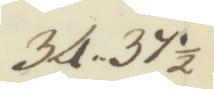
34„37½
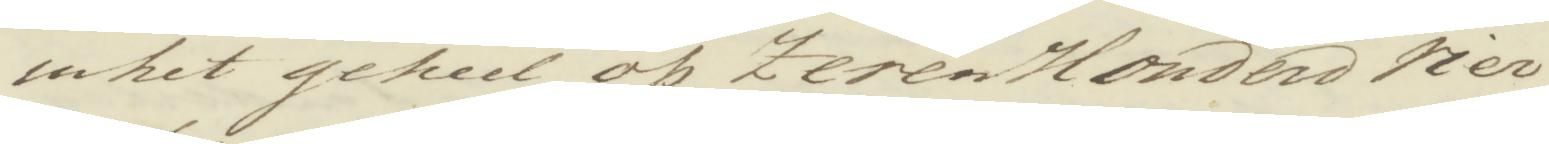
in het geheel op Zeven Honderd Vier
